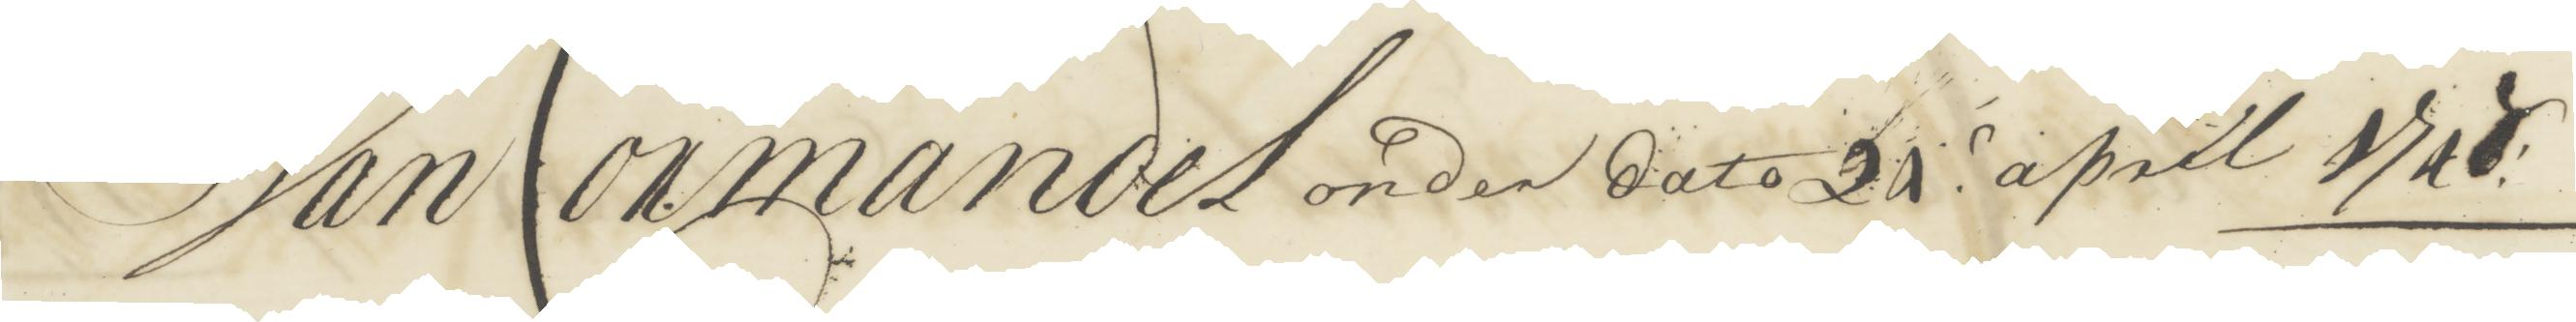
Van Cormandel onder dato 24:' april 1746.
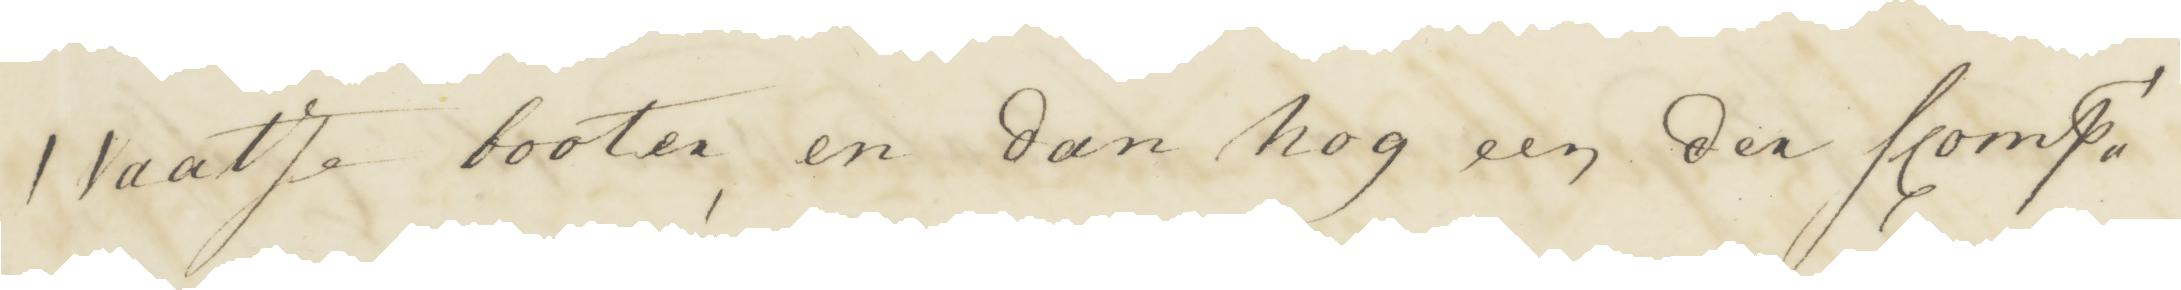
vaatje booter en dan nog een der scomp='
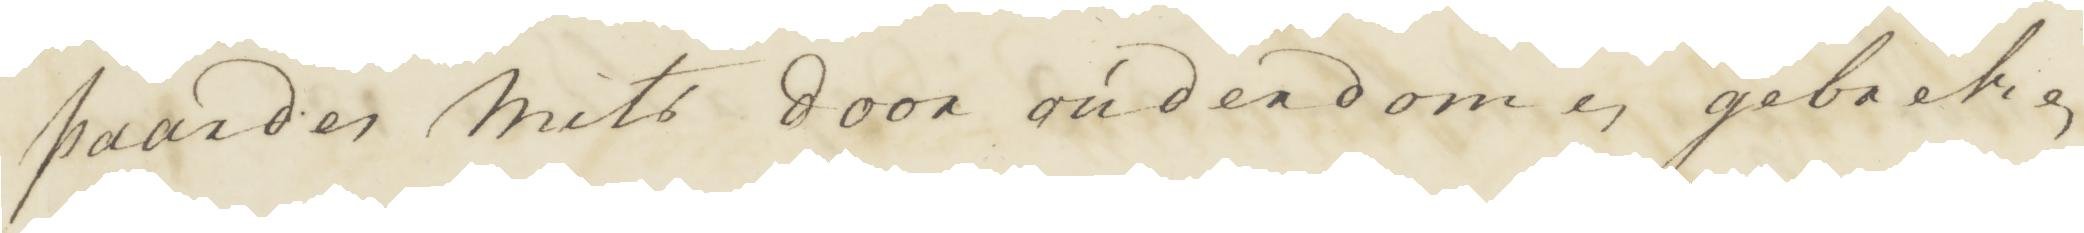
paarden mits door ouderdom en gebreken
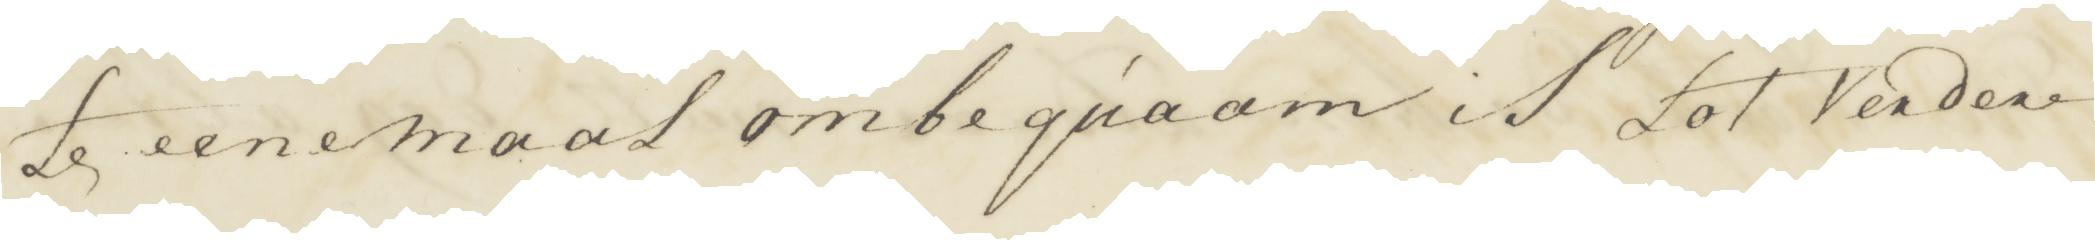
te eenemaal ombequaam is tot verdere
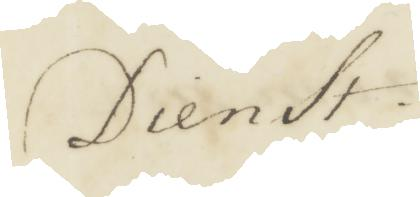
Dienst.
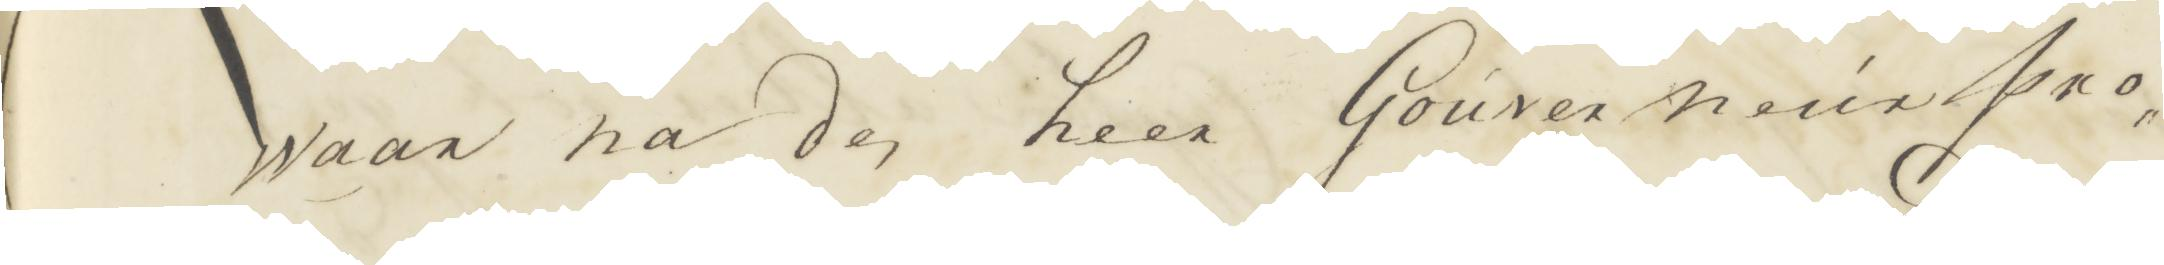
Waar na den heer Gouverneur pro„
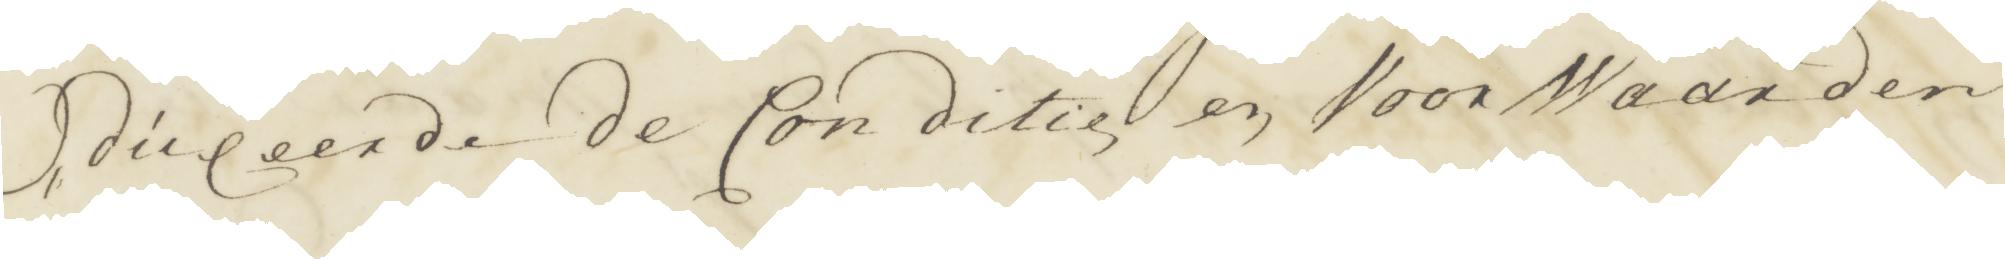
„duceerde de Conditien en voorwaarden
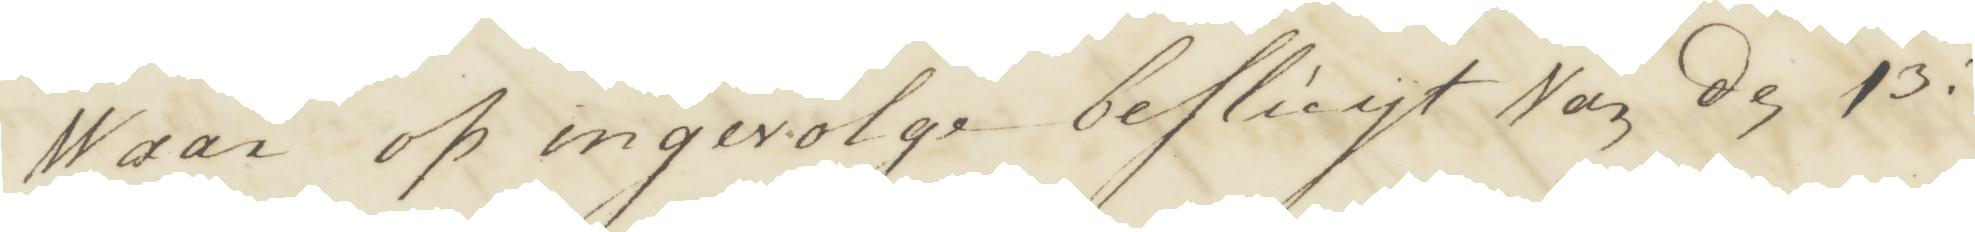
waar op ingevolge besluijt van den 13:
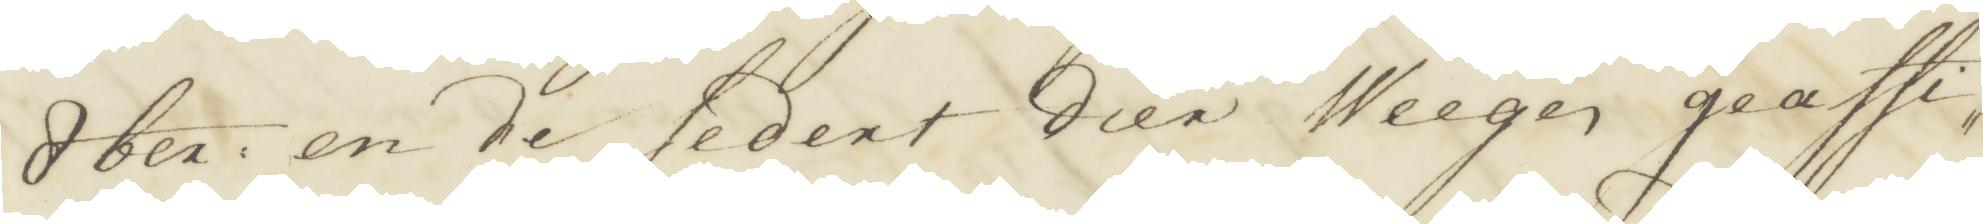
8ber: en de sedert dier weegen geaffi„
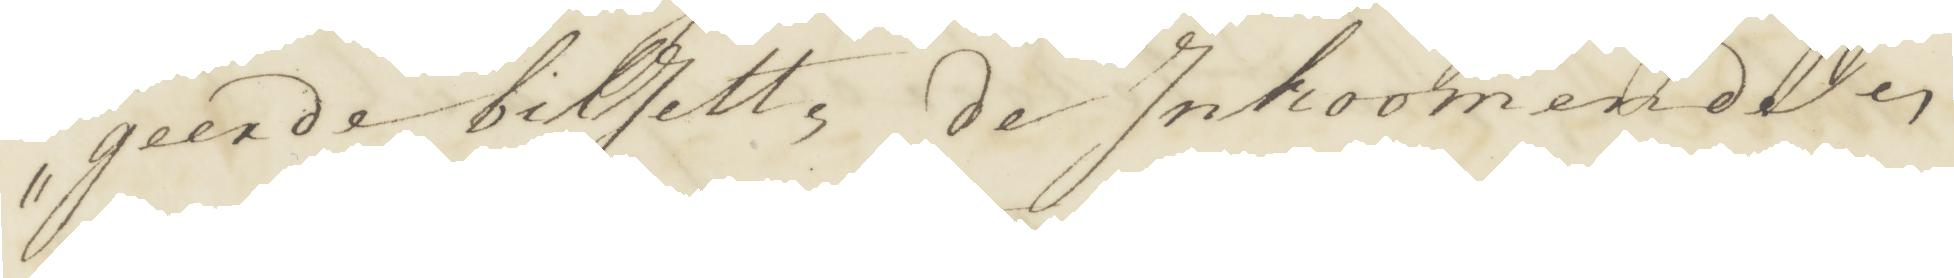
„geerde biljetten de Jnkoomende en
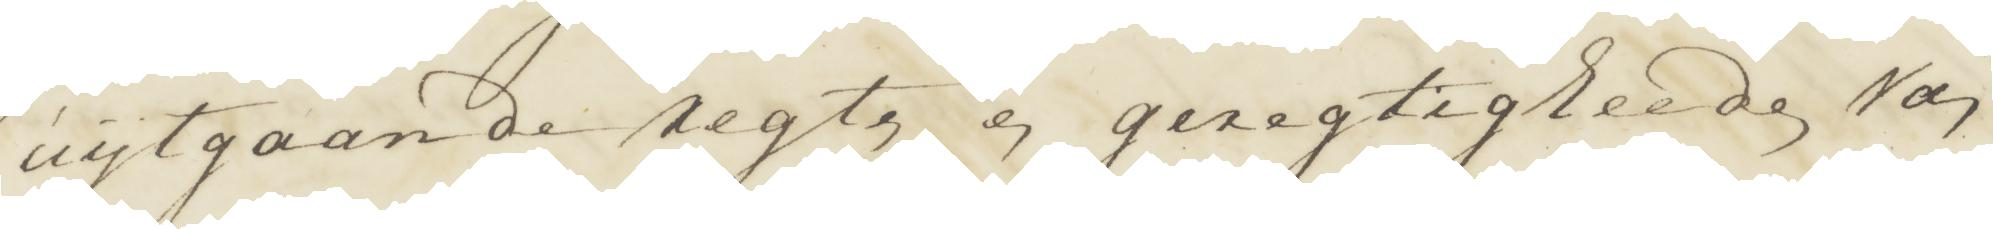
uijtgaande regten en geregtigheeden van
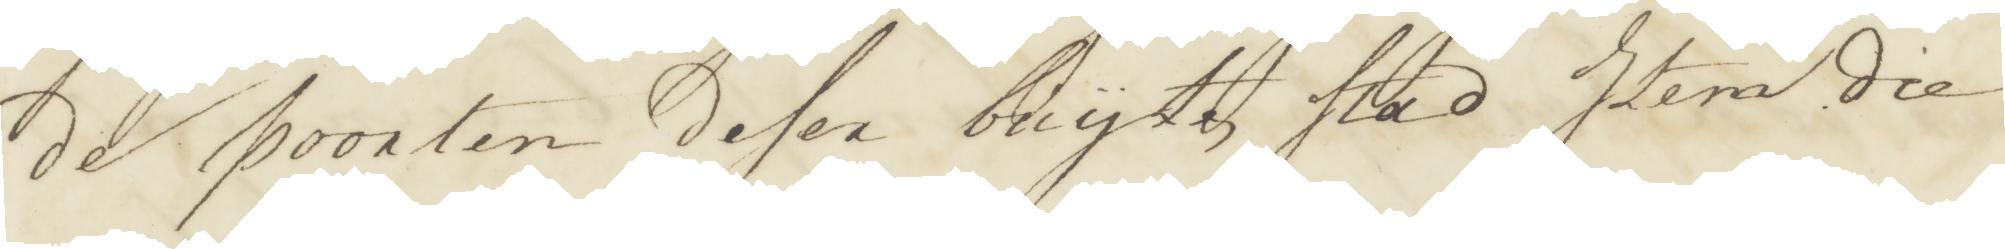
de poorten deser buijten stad, Jtem die
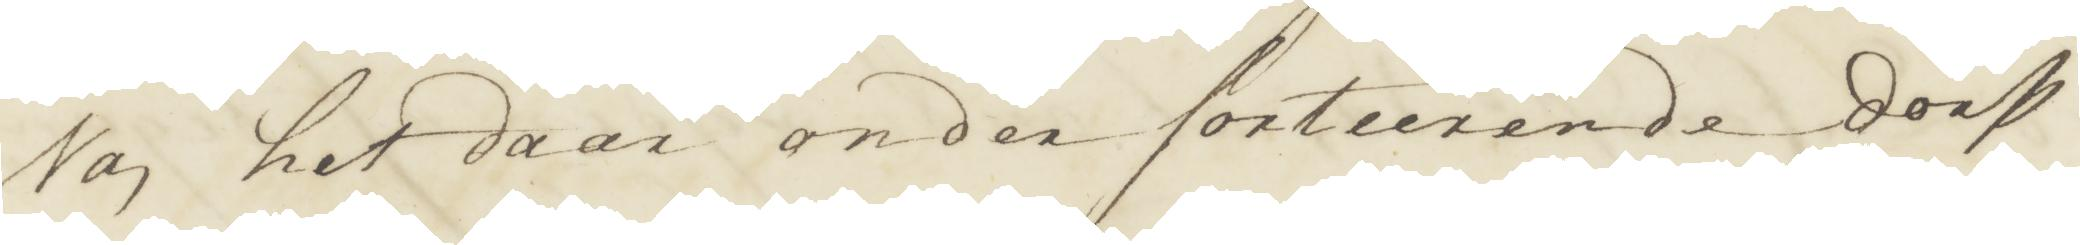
van het daar onder sorteerende dorp
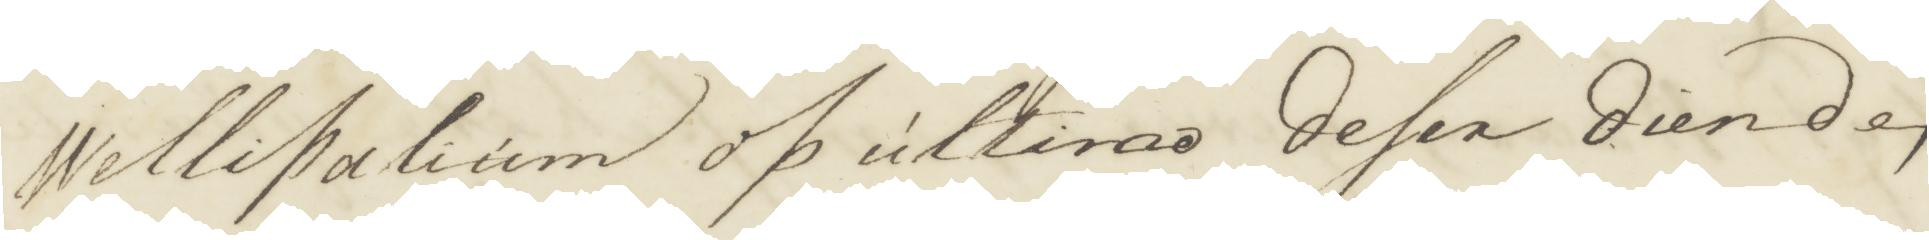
wellipalium op ultimo deser dienden
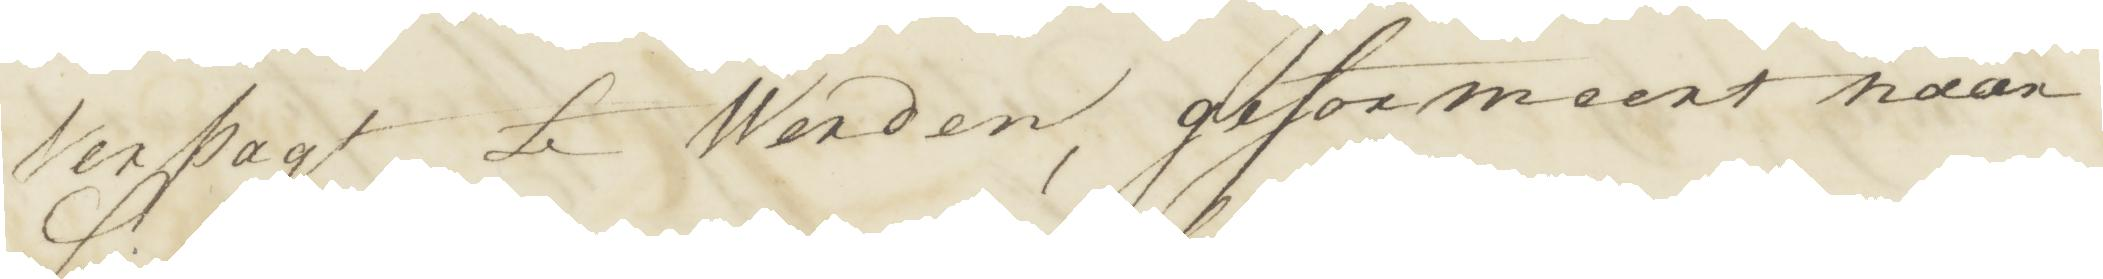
verpagt te werden, geformeert naar
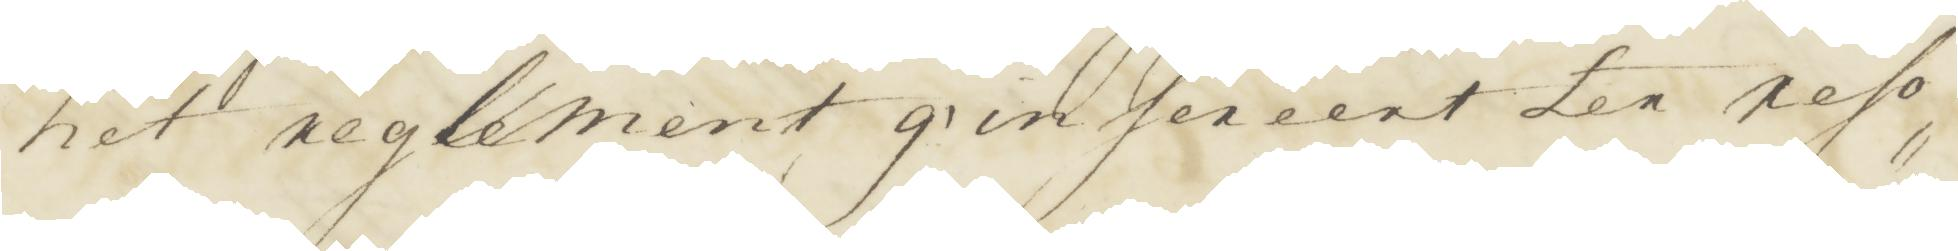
het reglement g'insereert ter reso„
